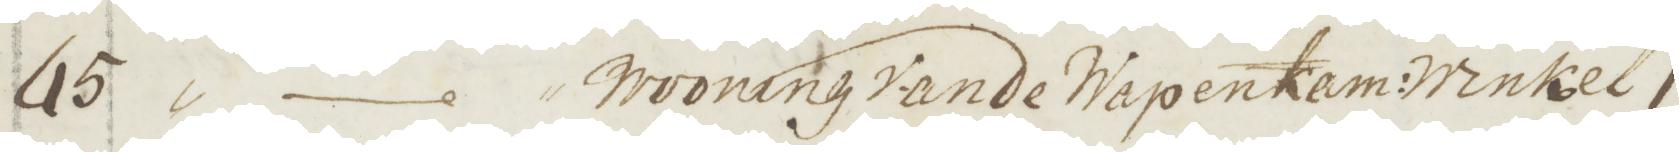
45 „ _o „ wooning van de wapenkam: winkel
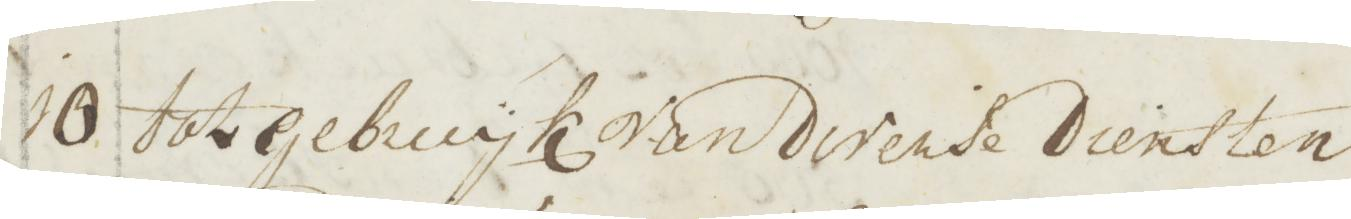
10 tot gebruijk van diverse diensten
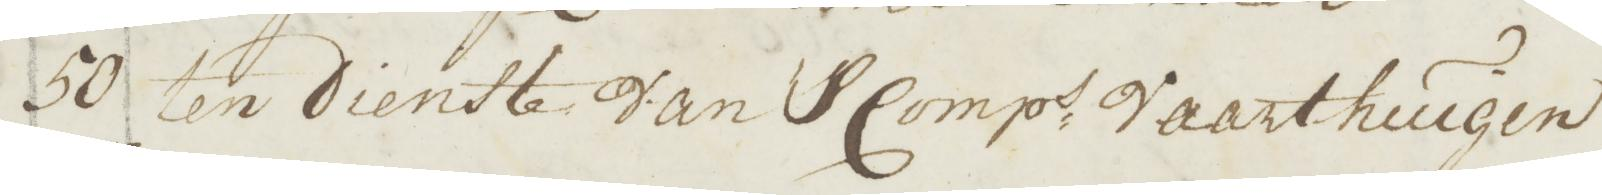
50 ten dienste van ’s Comp„s vaarthuigen
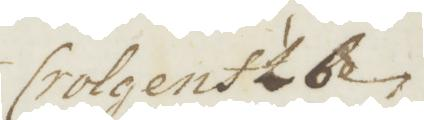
volgens't be„
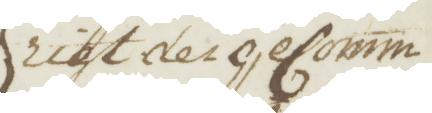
rigt der gecomm
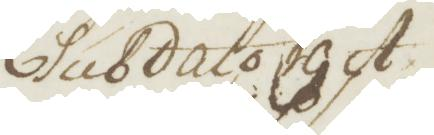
sub dato 19 A„
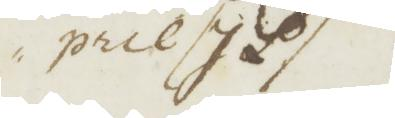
„pril /J L/
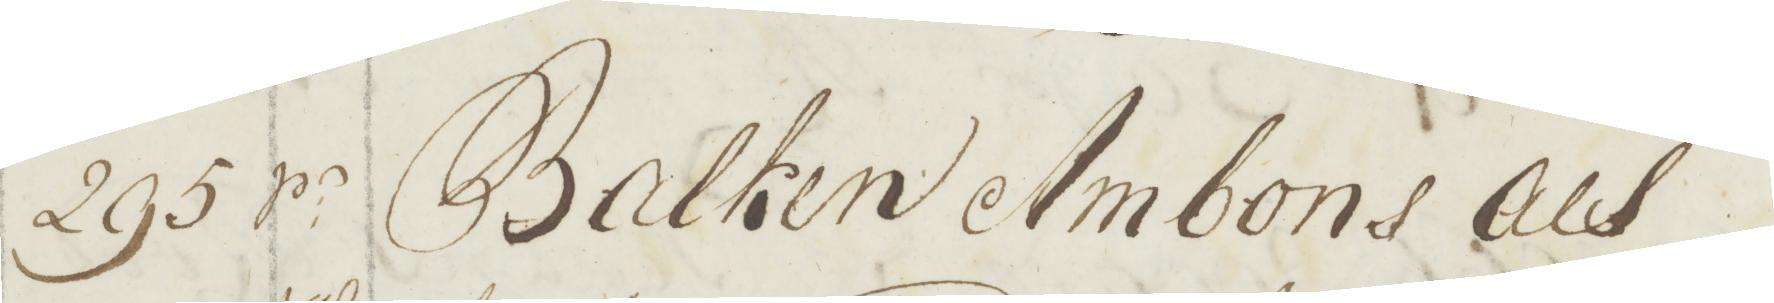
295 p:r Balken Ambons als
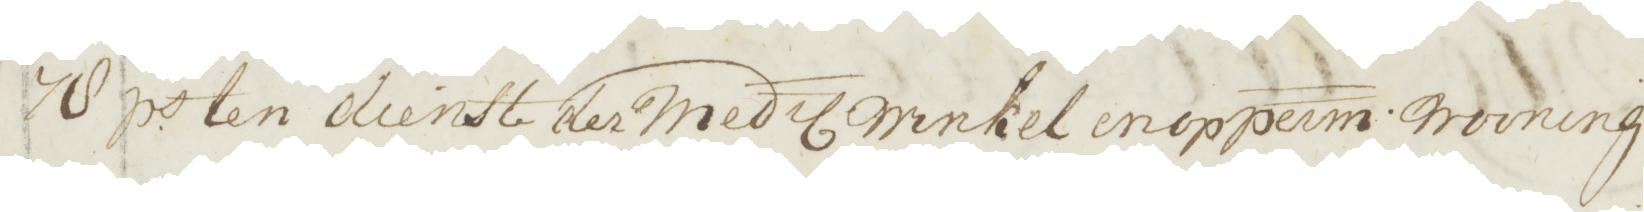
78 p.s ten dienste der medic winkel en opperm: woonin
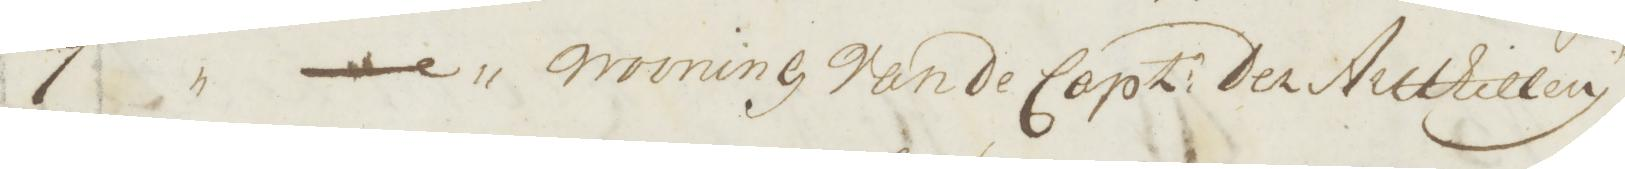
7 „ _o „ wooning van de Capt:n der Artthillery
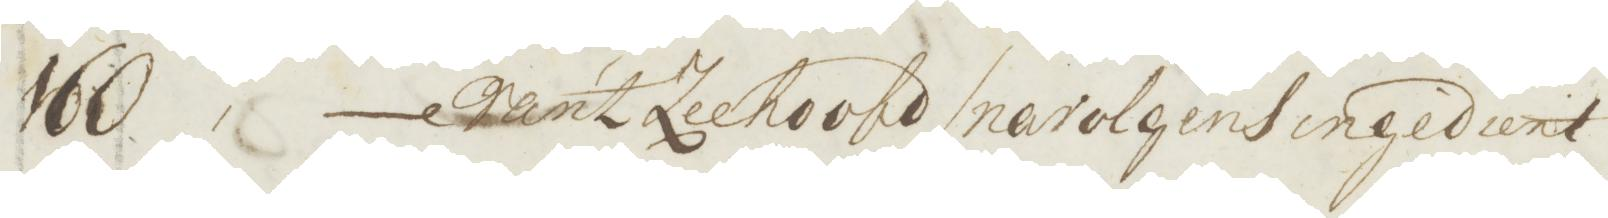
160 , _o van't zeehoofd / navolgens ingedient
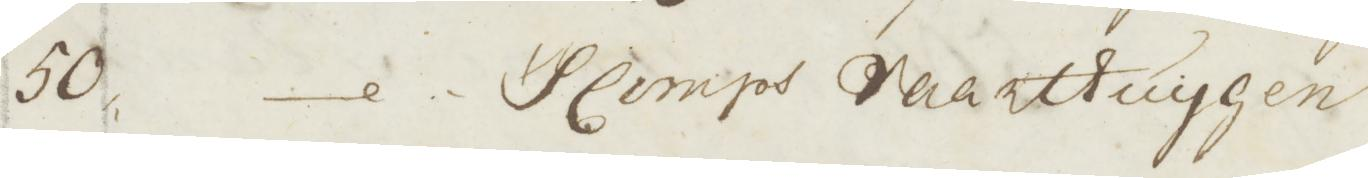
50„ _o „ 's Comps vaarthuijgen
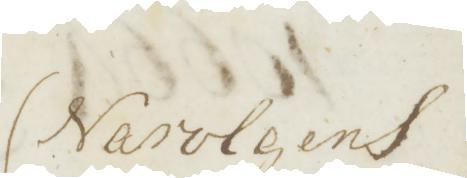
Navolgens
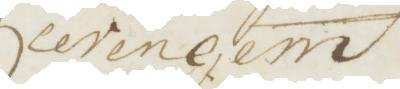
eevengem
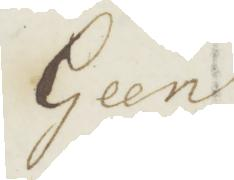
Geen
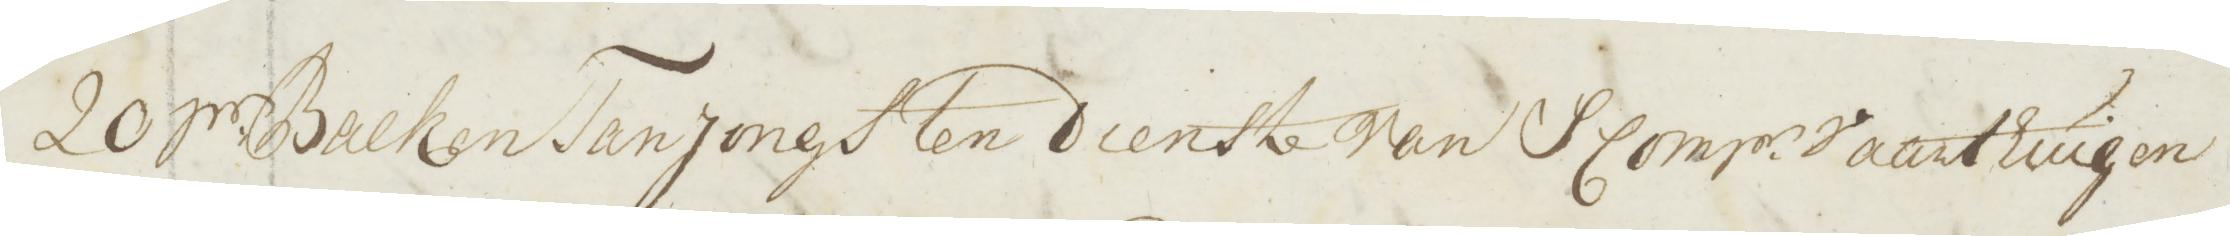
20 p.r Balken Tanjongs ten dienste van 's Comp:s vaarthuigen
